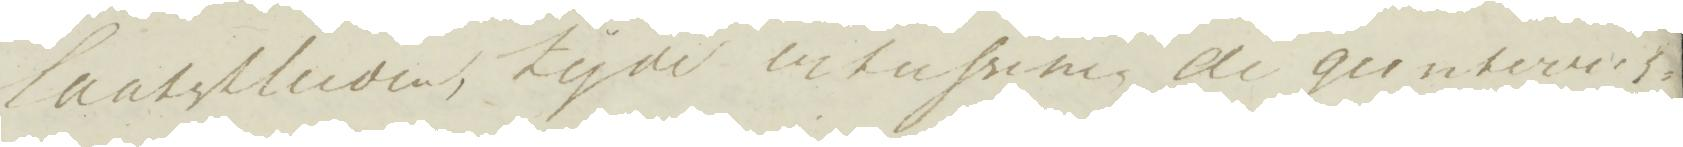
laatstleeden, zijde intusschen de geinterres=
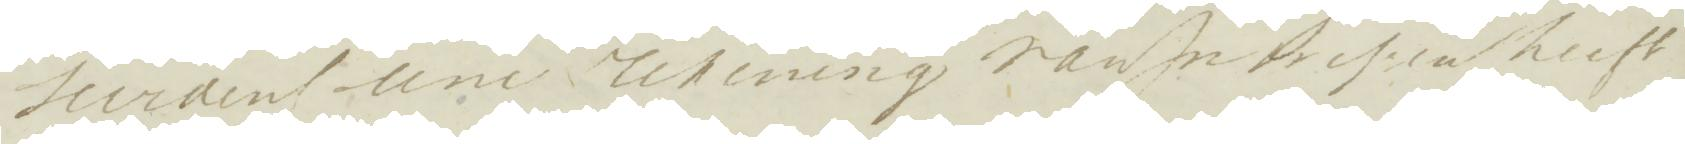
seerdens eene rekening van Jntressen heeft
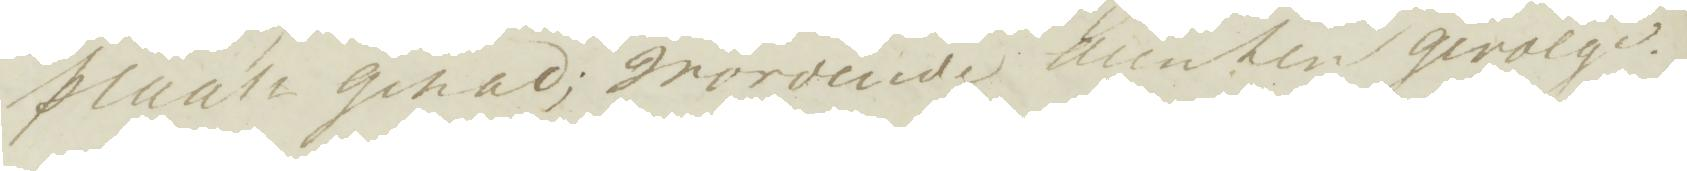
plaats gehad; wordende dien ten gevolge.
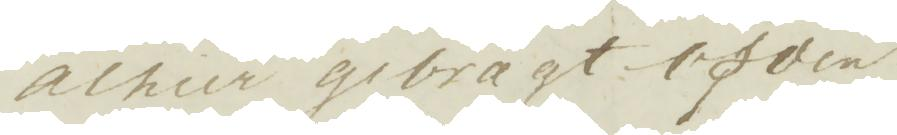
alhier gebragt tussen
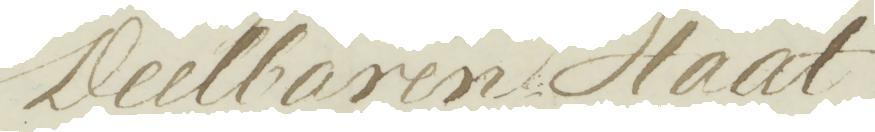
Deelbaren Staat
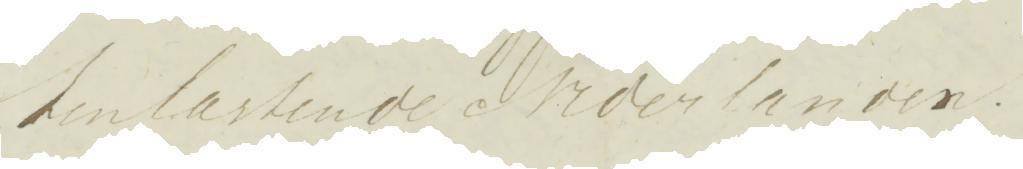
ten lastende Nederlanden.
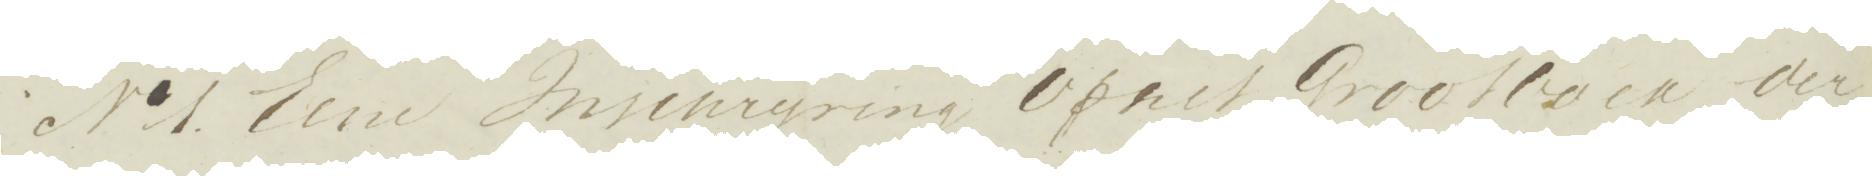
No 1. Eene Jnschryving op het Grootboek der
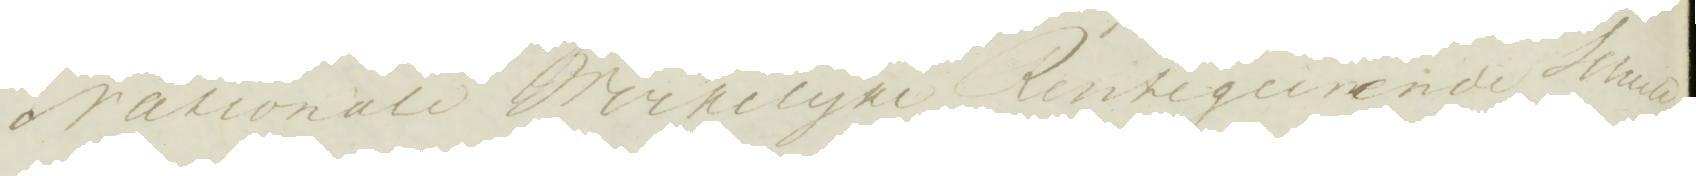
Nationale Werkelyke Rente geinende schuld,
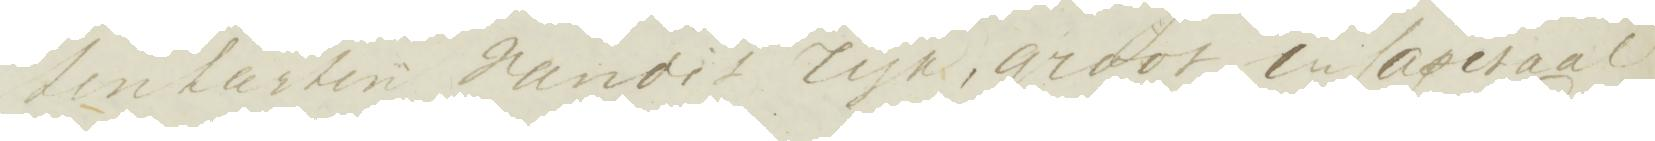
ten lasten van dit Ryk, groot in Capitaal
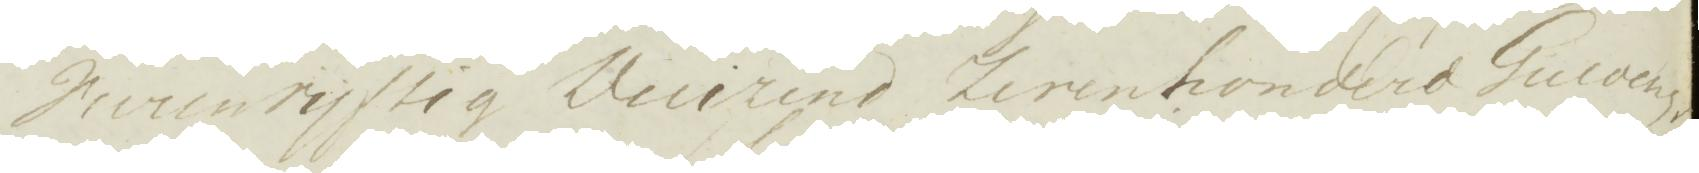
Vier en vijftig Duizend Zevenhonderd Guldens,
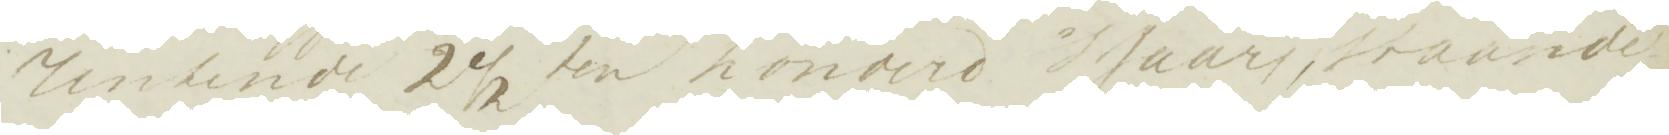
rentende 2½ ten honderd 's jaars, staande
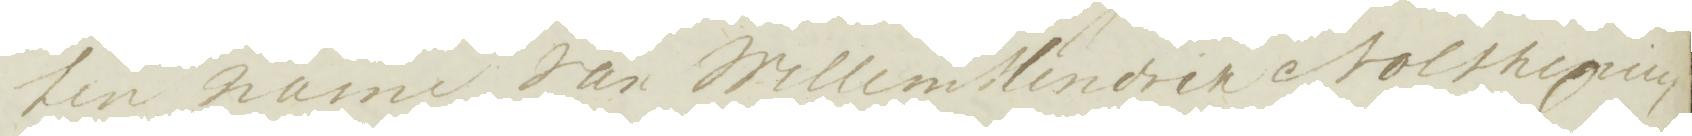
ten name van Willem Hendrik Nolthenen
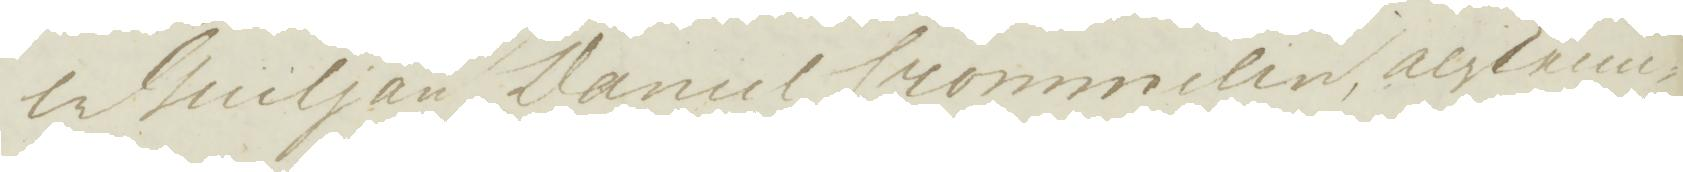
en Guiljan Daniel Crommelin, als Execu„
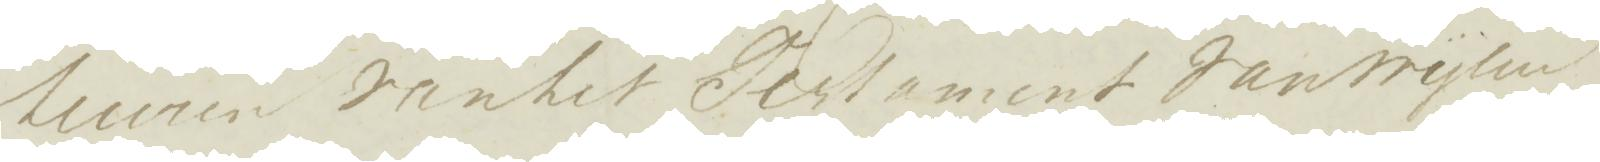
teuren van het Testament van wijlen
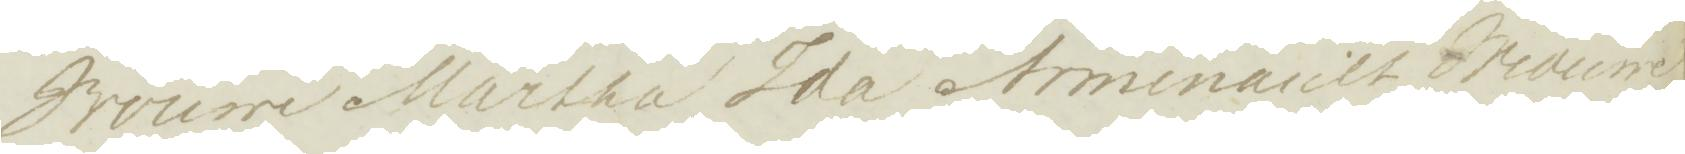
Vrouwe Martha Jda Armenault Vrouwe
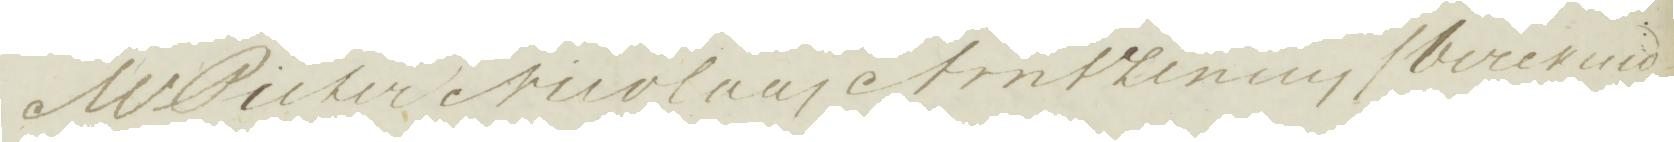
Mr. Pieter Nicolaas Arntzenius / berekend
